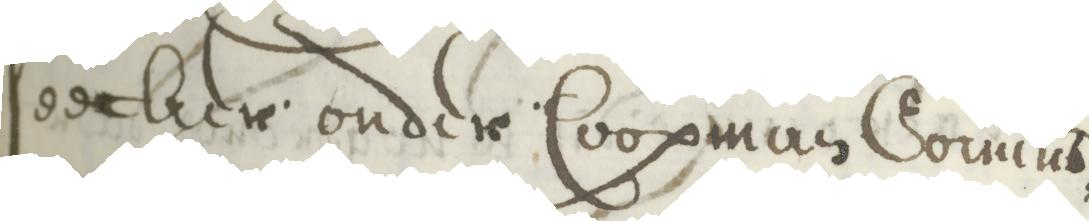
seecker onder Coopman Cornelis
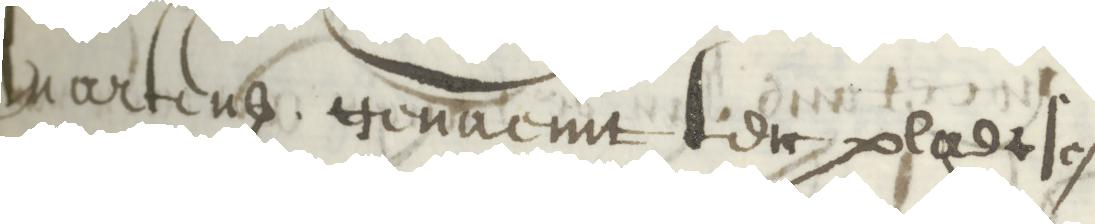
martens genaemt ter plaetsen
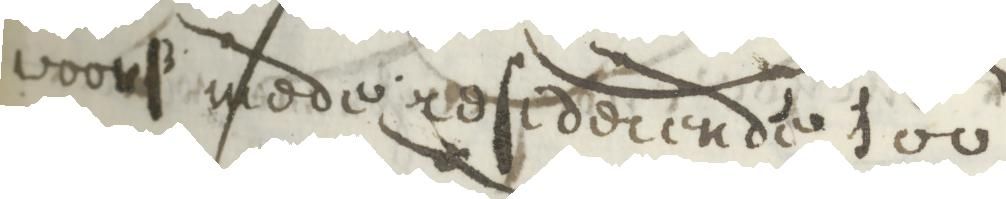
voorsz mede residerende soo
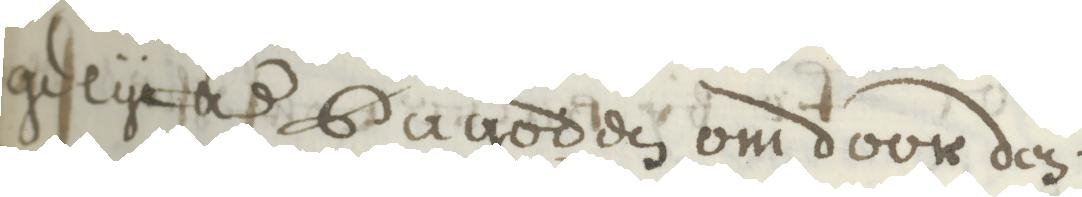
gelijcke Pagoden om door den
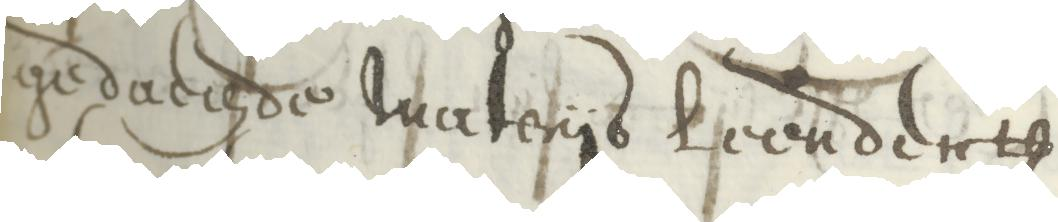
gedaechde mathijs leenderts
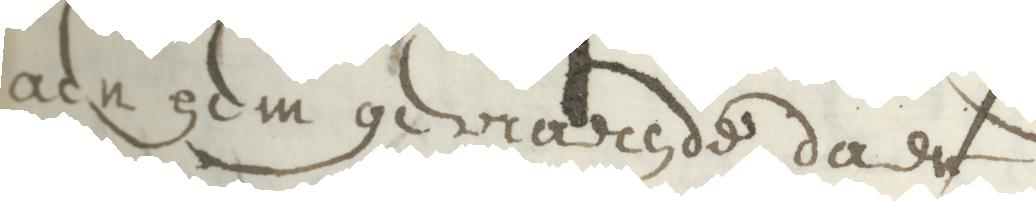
aen hem gevraechde daer
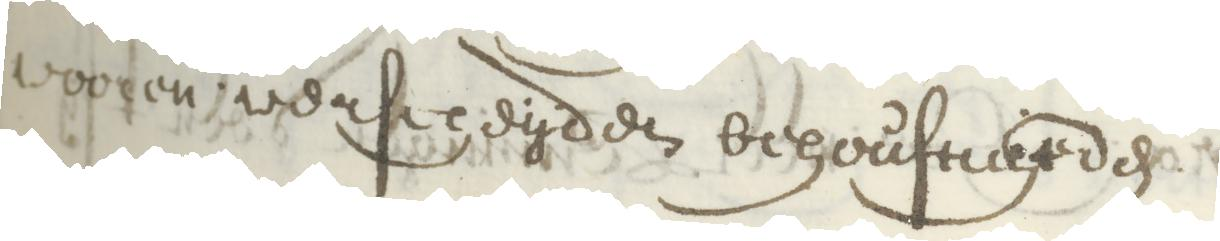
vooren verscheijden begousticgt den
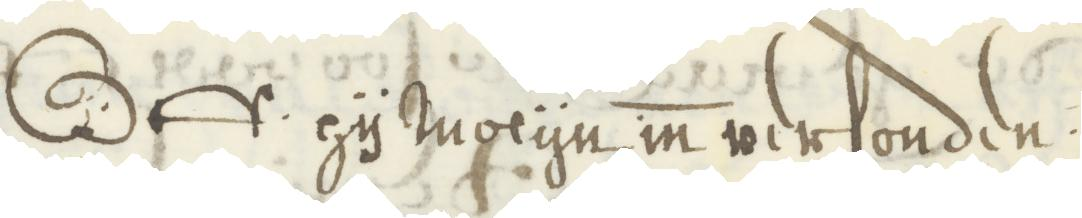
Off hij molijn in versonden
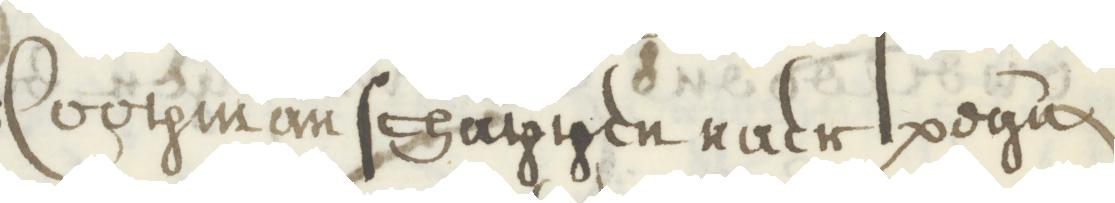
Coopman schappen naer pegu
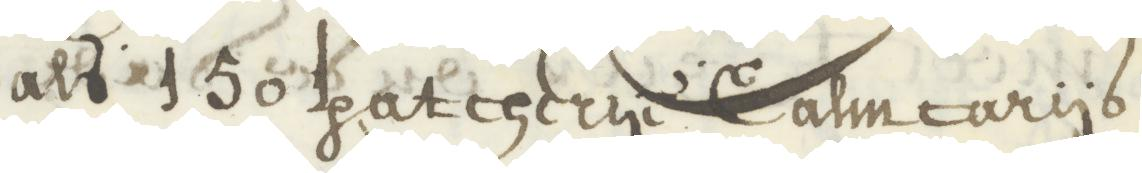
als 150 patcherije Calm carijs
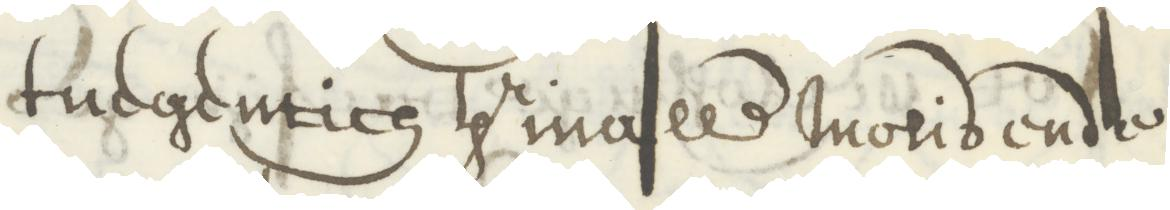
tuegentich pr malle molid ende
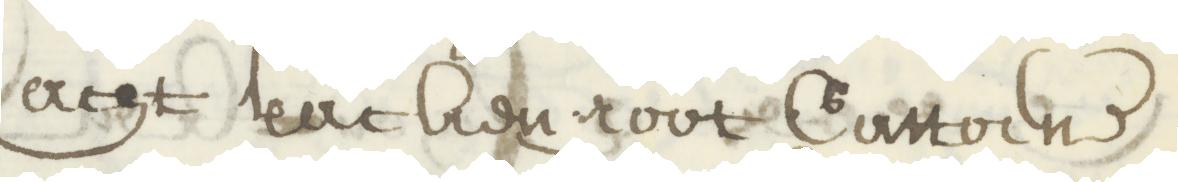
acht packen root Cattoene
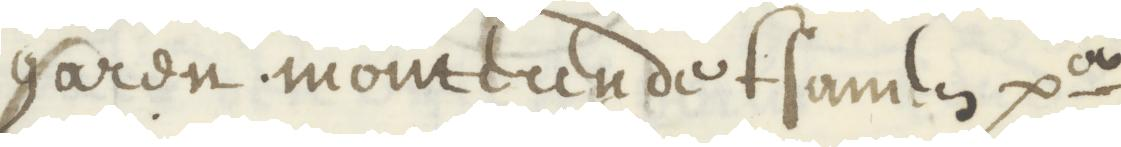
garen monterende tsamen p=a
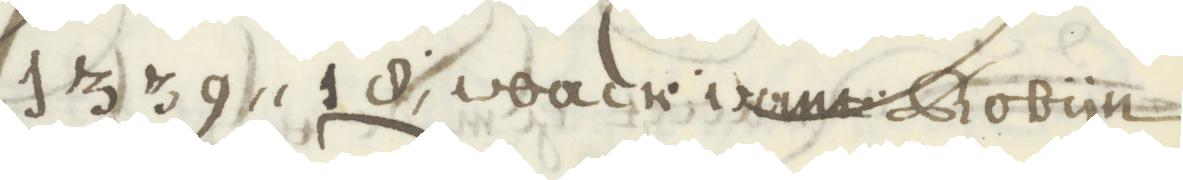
1339 „ 18, waer vant Robijn
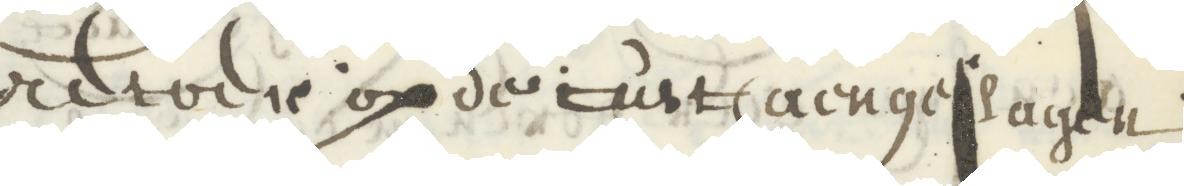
retoer op de cust aen geslagen
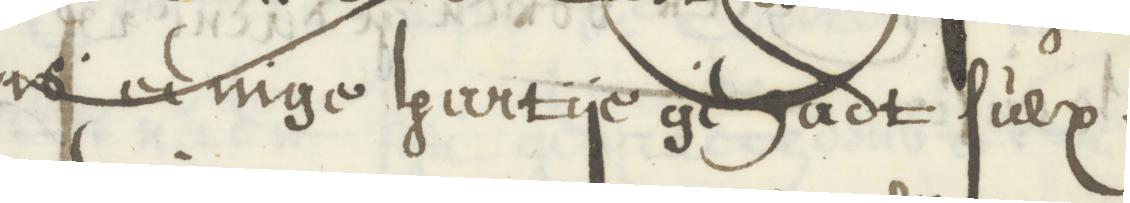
is eenige partije gehadt sulx
